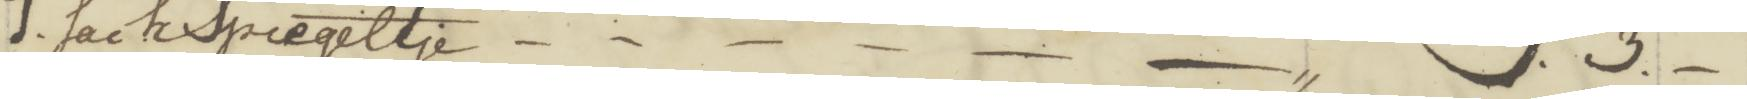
1. sackspiegeltje - - - - - - „ 3. 3. —
